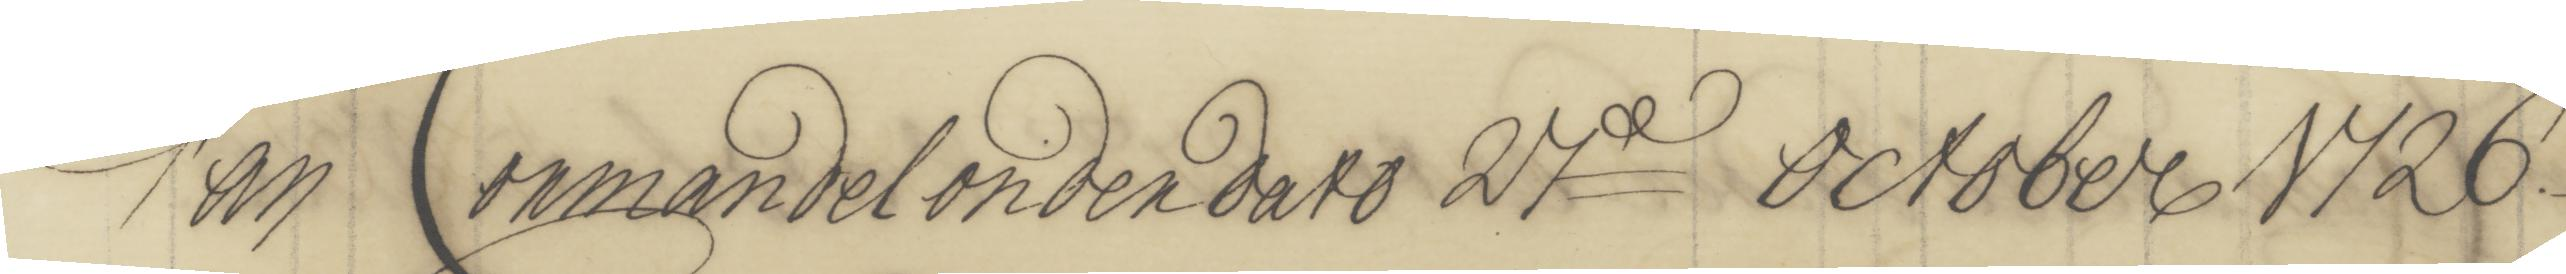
Van Cormandel onder dato 27=e October 1726.
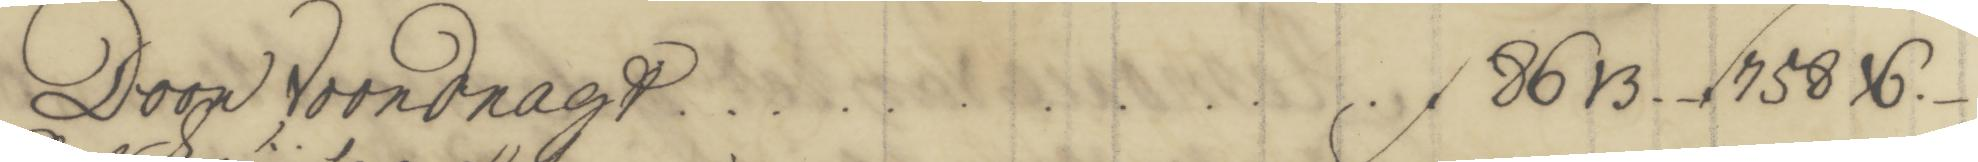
Door voordragt - - - - - - - - - - - ƒ 8613. — ƒ758 16. —
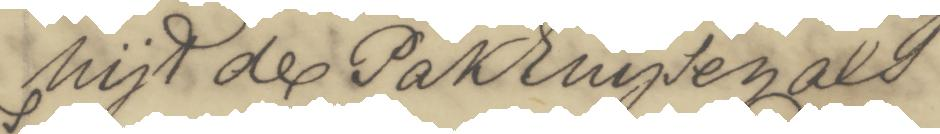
uijt de Pakhuijsen als
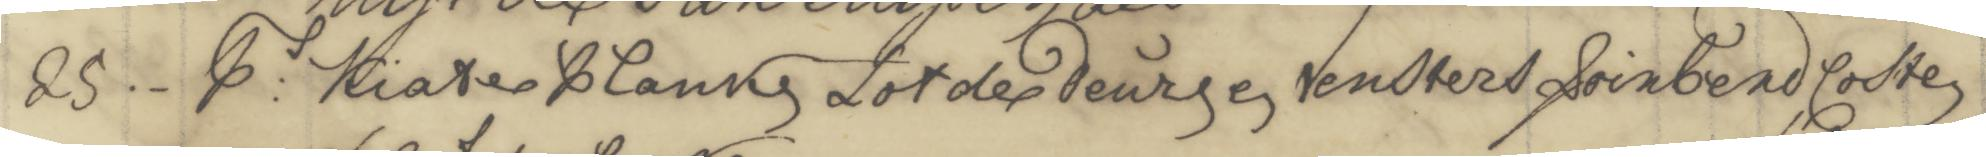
25. — p:s kiate planken tot de deuren en vensters veroirberd Costen
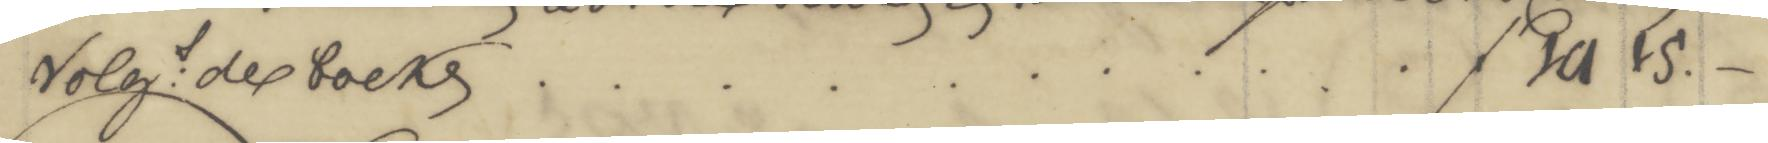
Volg:s de boeken - - - - - - - - - - - ƒ 14 15. —
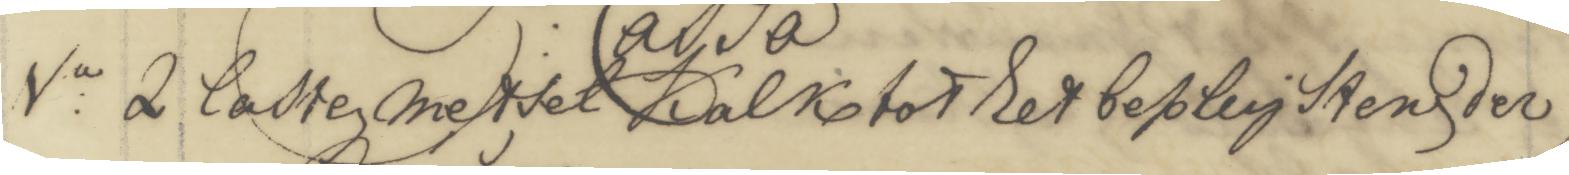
1:a 2 lasten metsel kalk tot het bepleijsten der
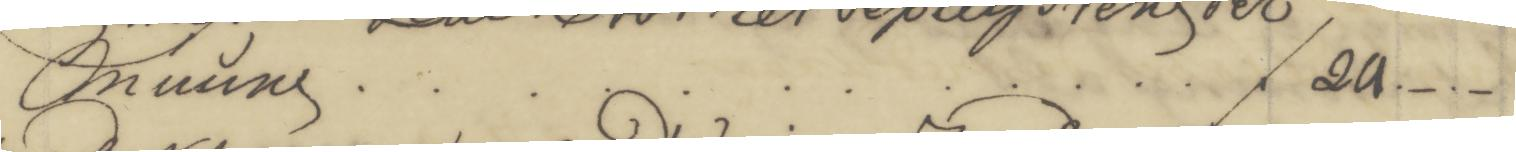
muuren - - - - - - - - - - - - ƒ 24. —. —
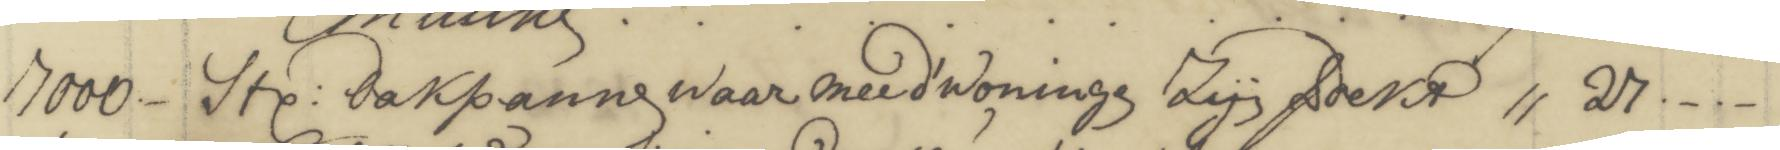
7000. — Stx: dakpannen waar meed' woningen zijn verdekt „ 27. —. —
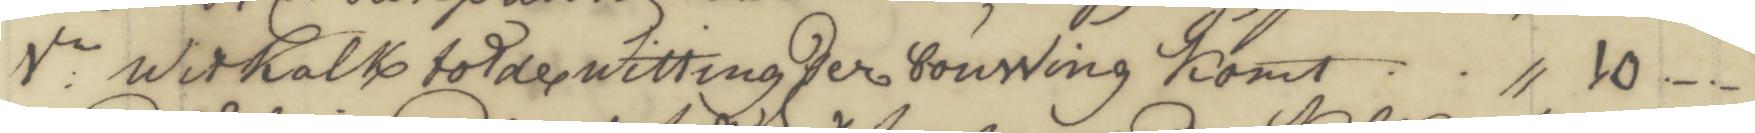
1:a witkalk tot de witting der bouwing komt - - „ 10. —. —
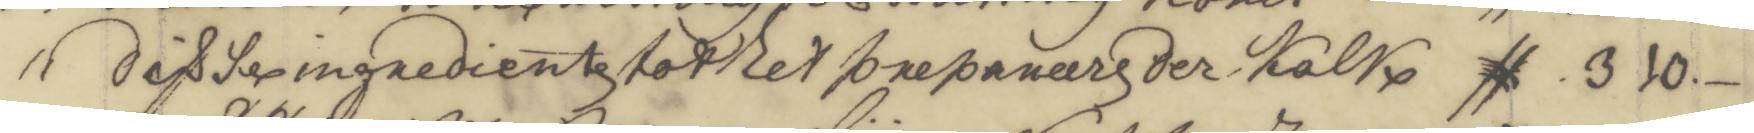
„ diverse ingredienten tot het prepareeren der kalk „ 3 10. —
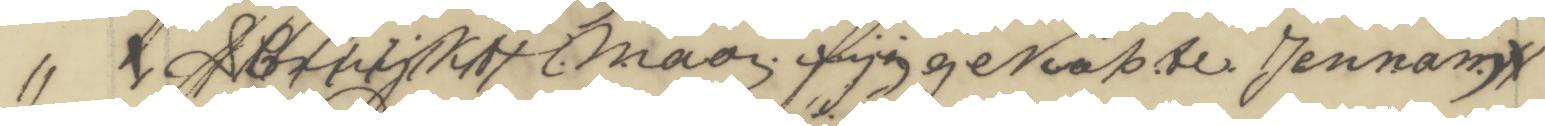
„ 1 verbruikt maan fijn gekapte Jennam„
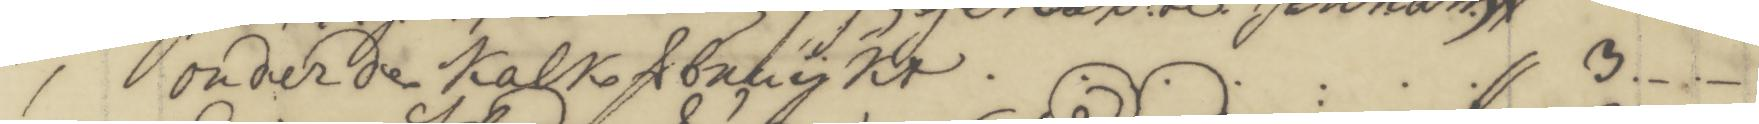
„ onder de kalk verbruijkt - - - - - - - „ 3. — . —
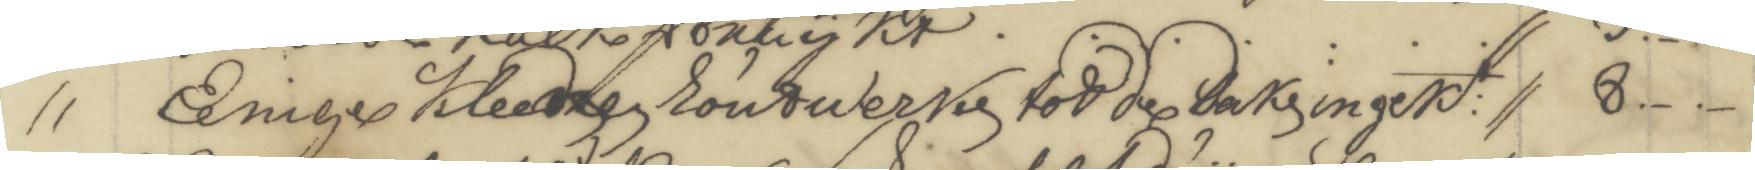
„ Eenige kleedeen houdwerken tot de daken in gek:t „ 8. —. —
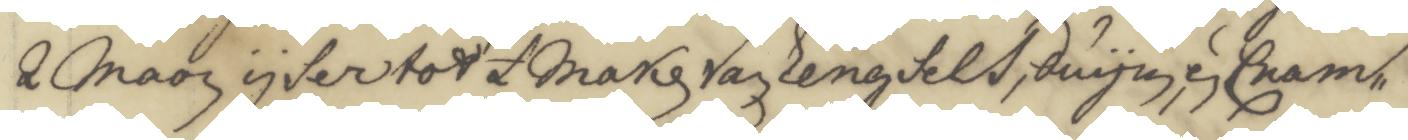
2 Maan ijser tot ’t Maken van hengsels, duijm, en Cram„
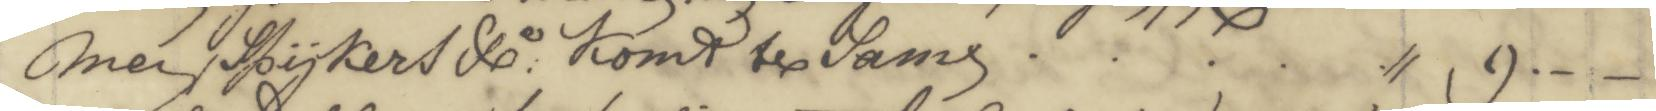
men, spijkers Et:a komt te samen - - - - „ 9. — —
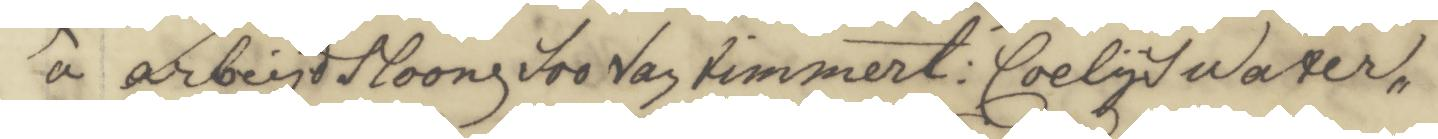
â arbeijdsloonen soo van timmerl: Coelijs water„
